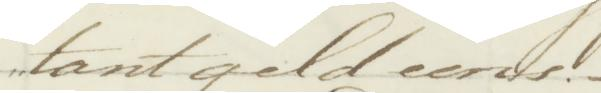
„tant geld eens.
